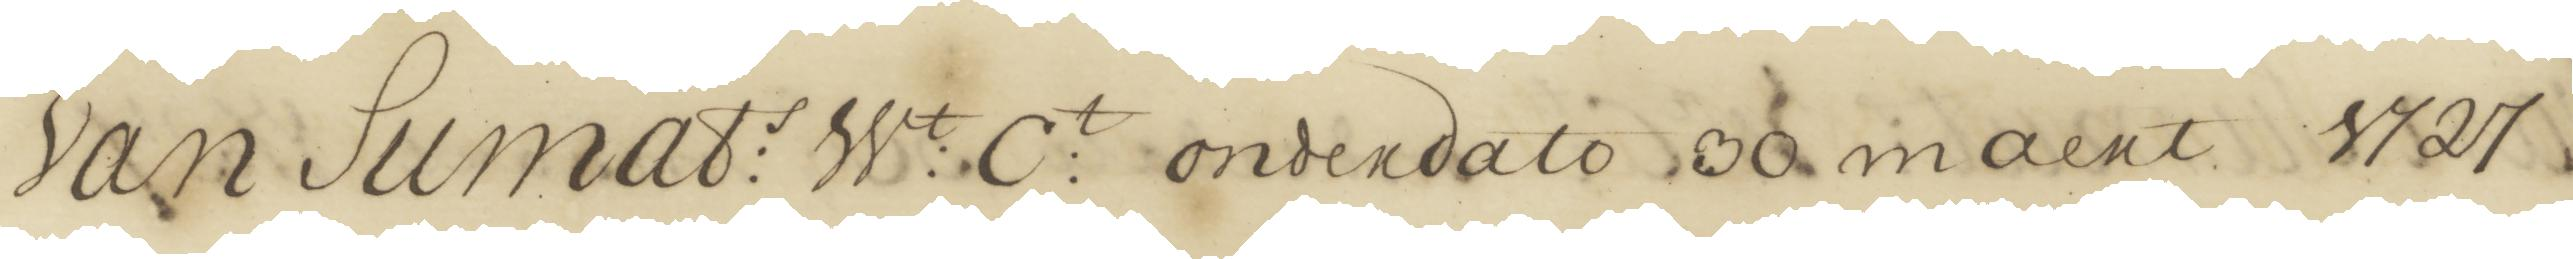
Van Sumat:s W:t C:t onderdato 30 maert: 1727
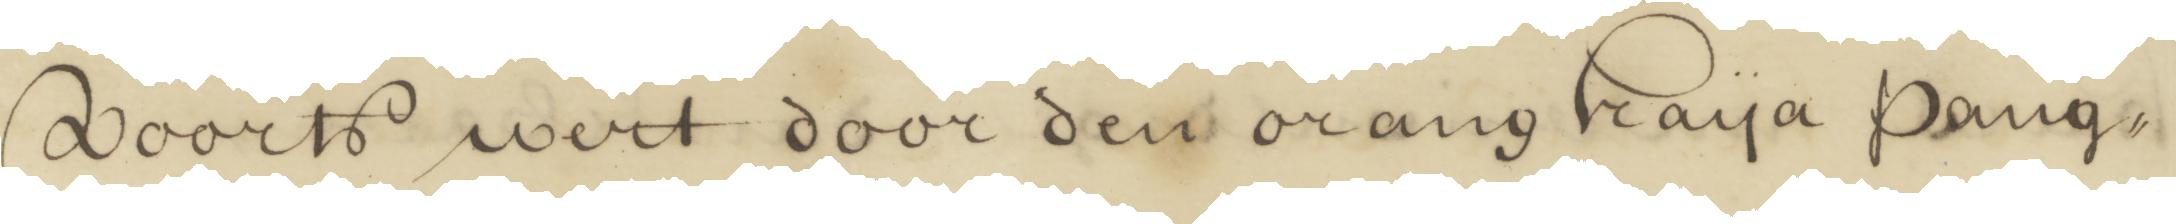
Voorts wert door den orang kaija pang„
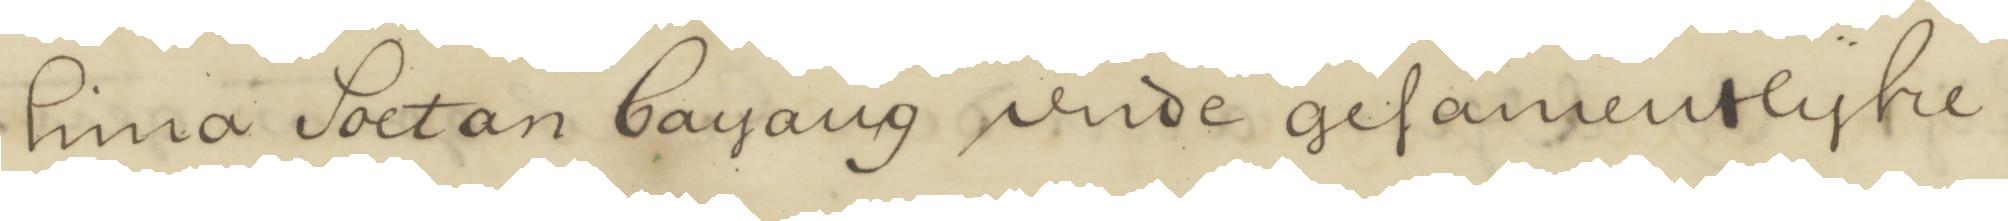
lima Soetan bayang ende gesamentlijke
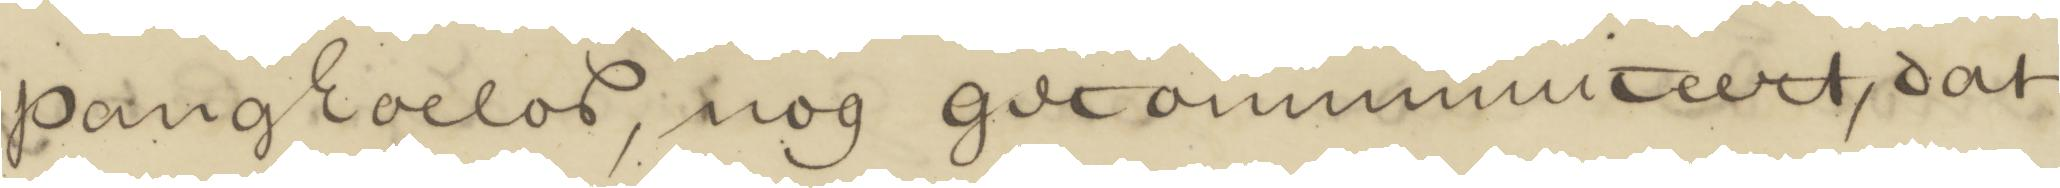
panghoelos, nog gecommuniceert, dat
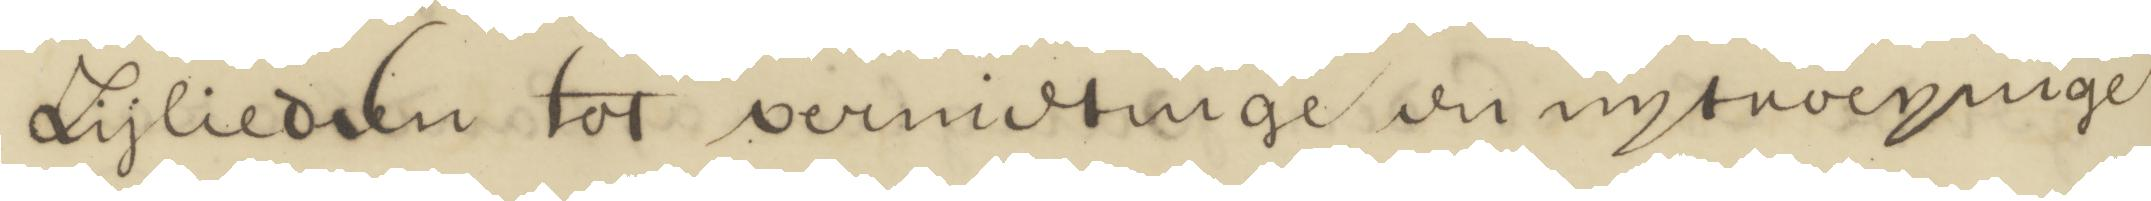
Zijlieden tot vernietinge en uytroeyinge
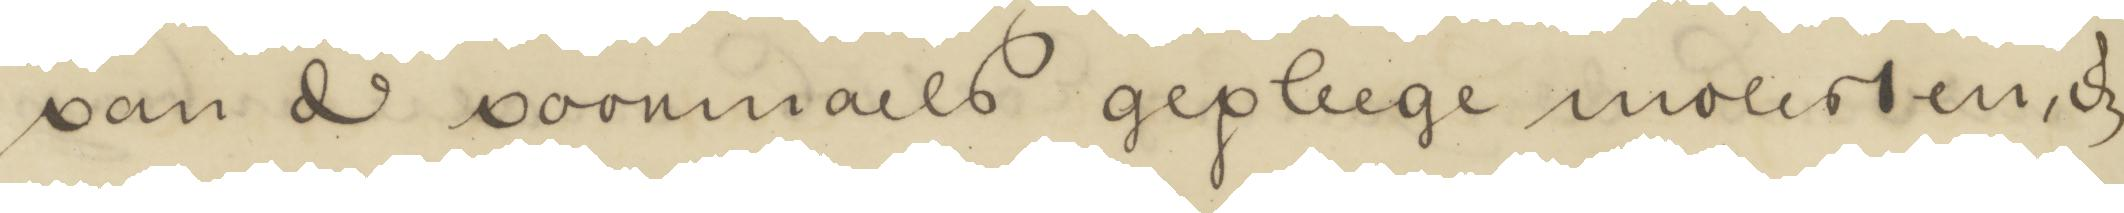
van de voormaels gepleege molisten, ende
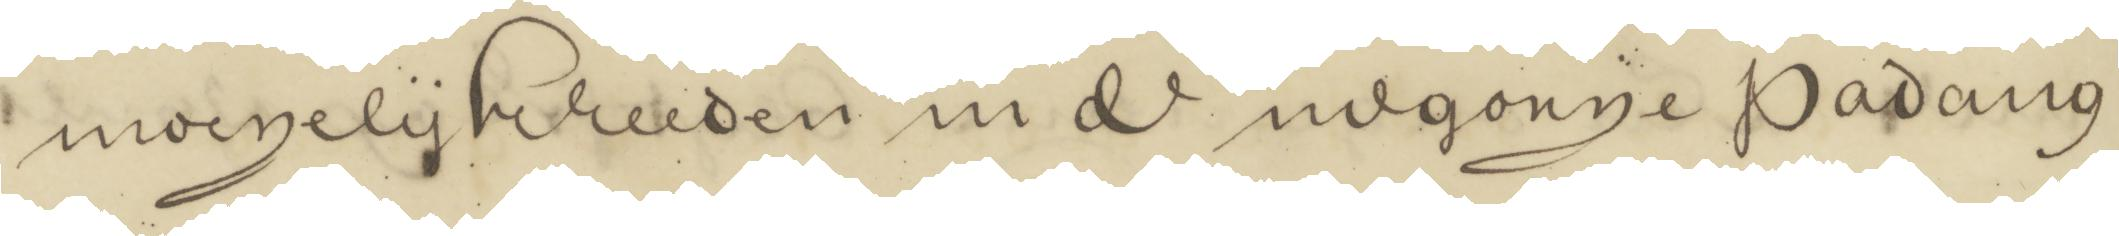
moeyelijkheeden in de negorije Padang
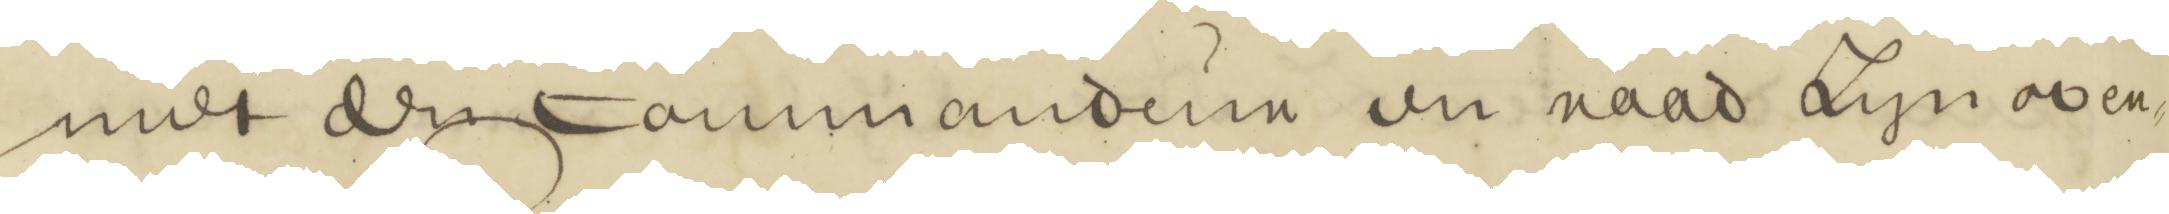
met den commandeur en raad Zyn over-
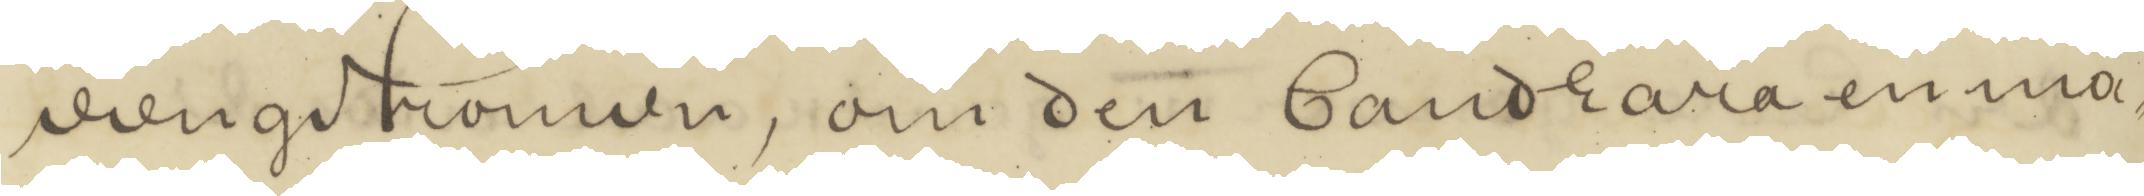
eengekomen, om den bandhara en ma„
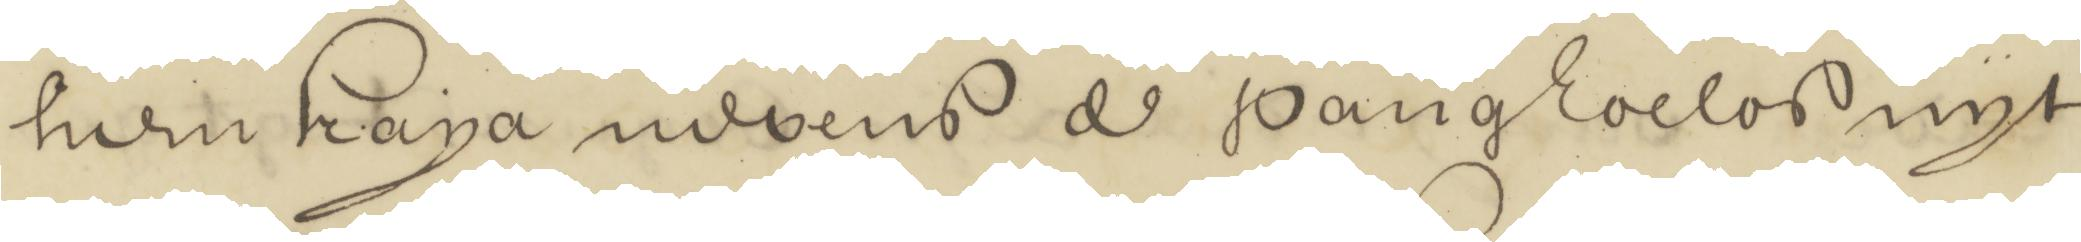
hem kaya nevens de panghoelos uijt
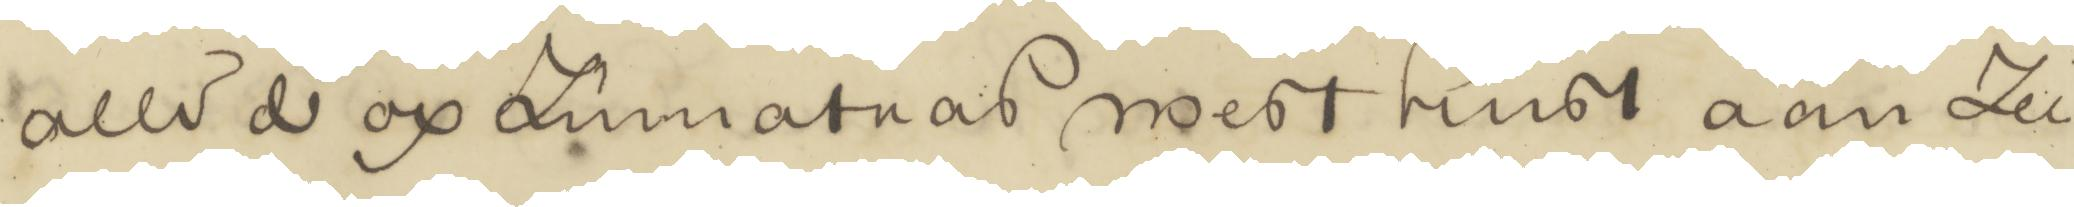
alle de op Zumatras west kust aan Zei
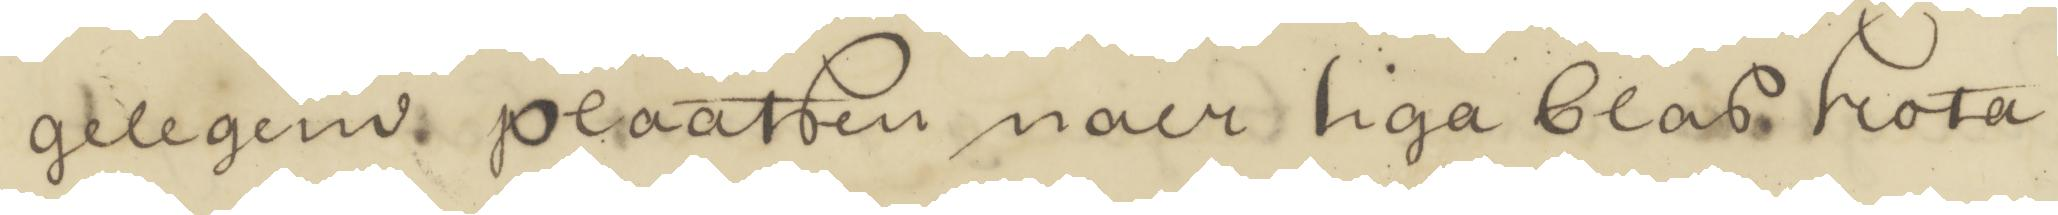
gelegene plaatsen naer tiga blas kota
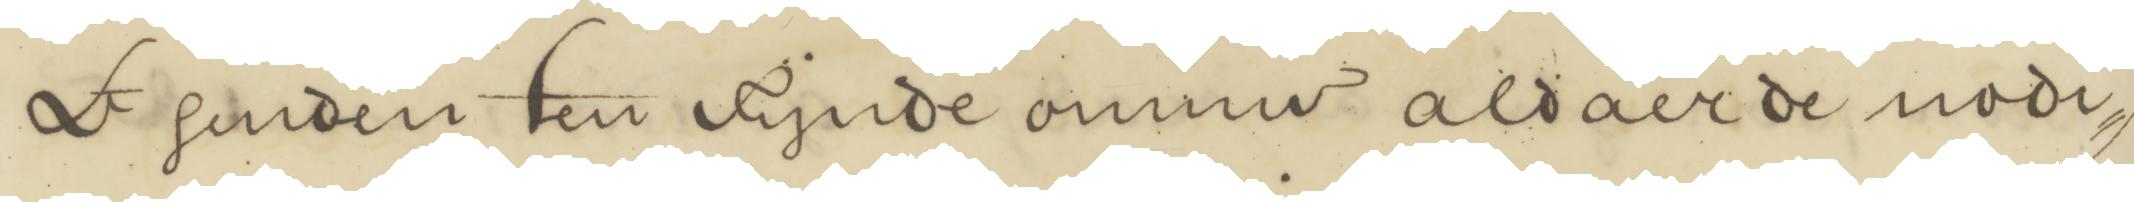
te sinden ten Eijnde omme aldaer de nodi„
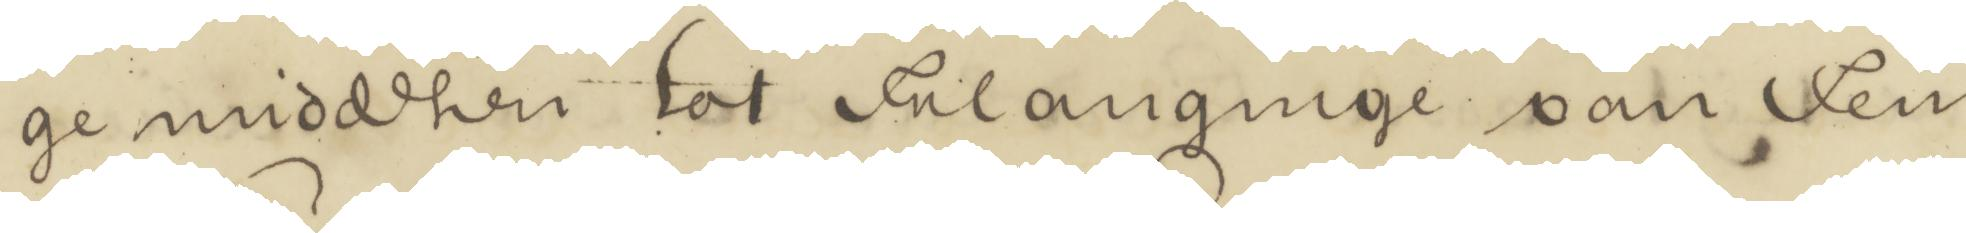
ge middelen tot Erlanginge van Een
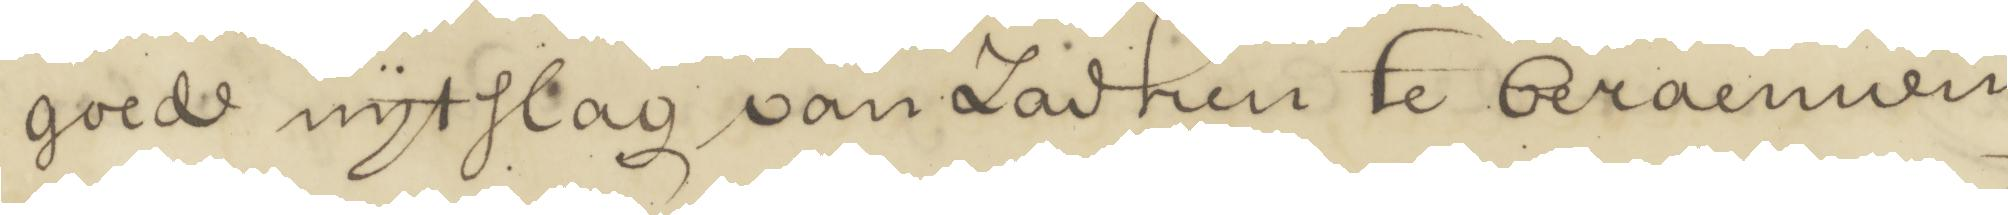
goede uijtslag van Zaeken te beraemen
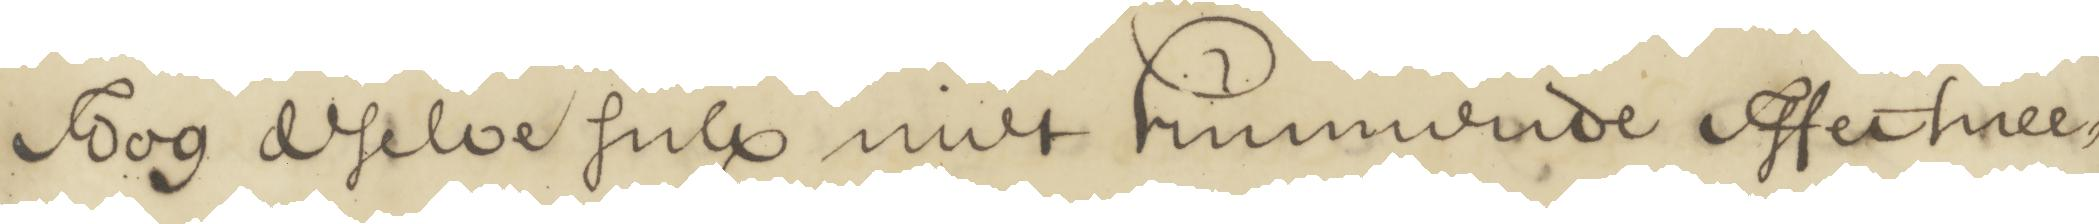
Edog deselve sulx niet kunnende effectuee„
